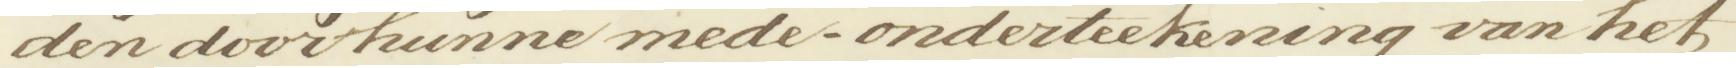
den door hunne mede - onderteekening van het
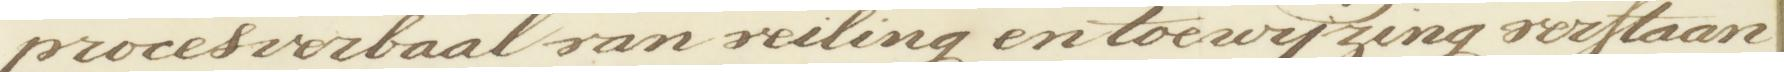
procesverbaal van veiling en toewijzing verstaan
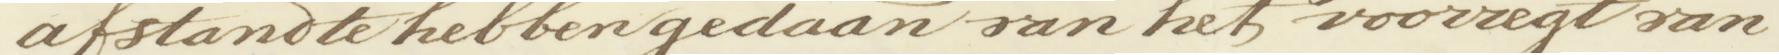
afstand te hebben gedaan van het voorregt van
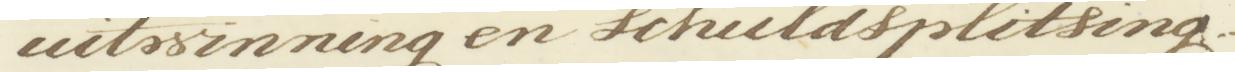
uitwinning en schuldsplitsing.
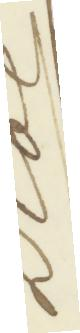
270C
